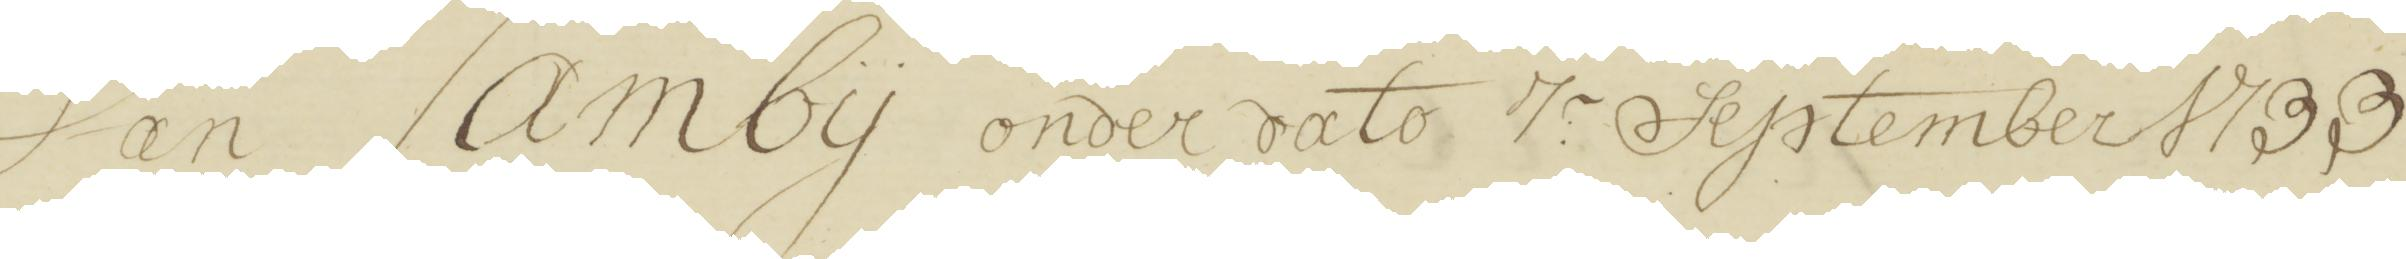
Van Jambij onder dato 7: September 1733
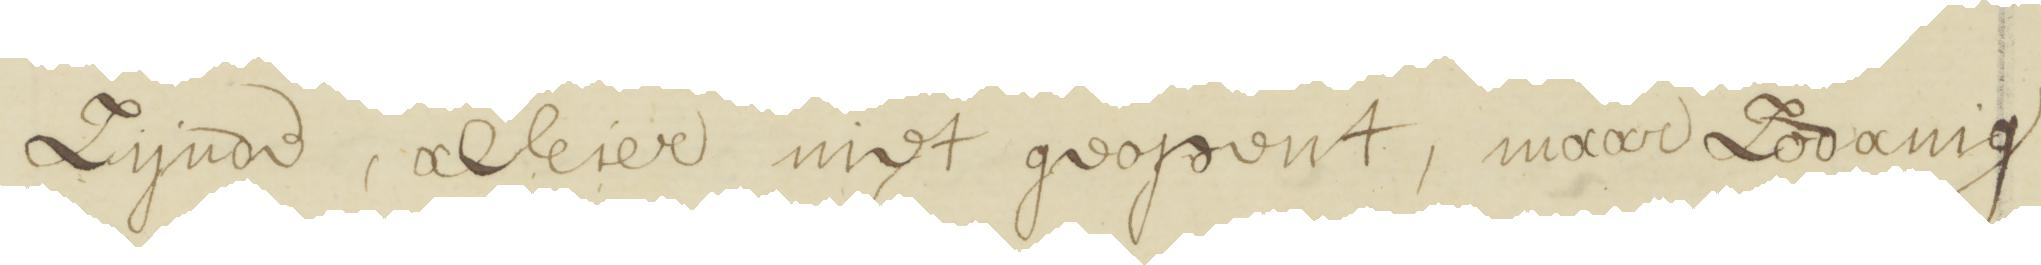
zijnde, alhier niet geopent, maar zodanig
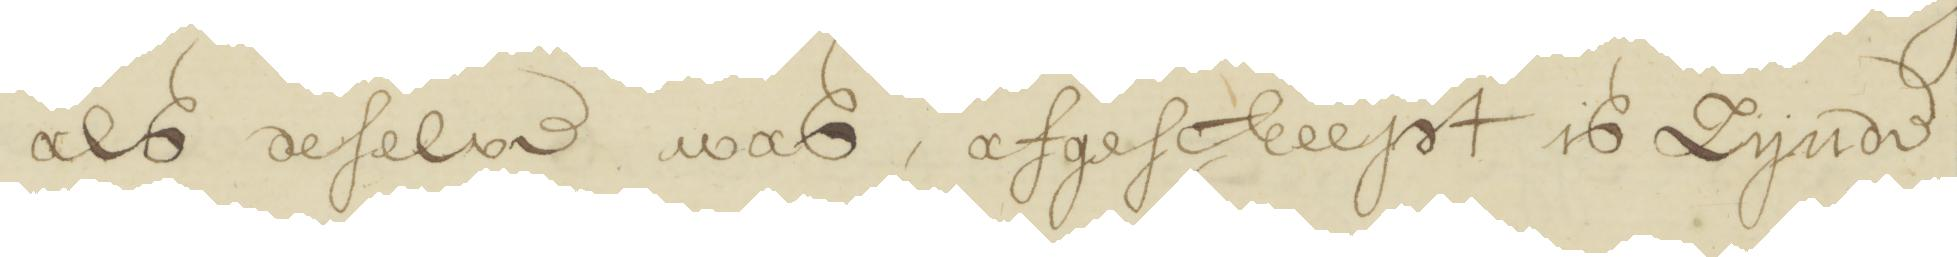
als deselve was, afgescheept is zijnde
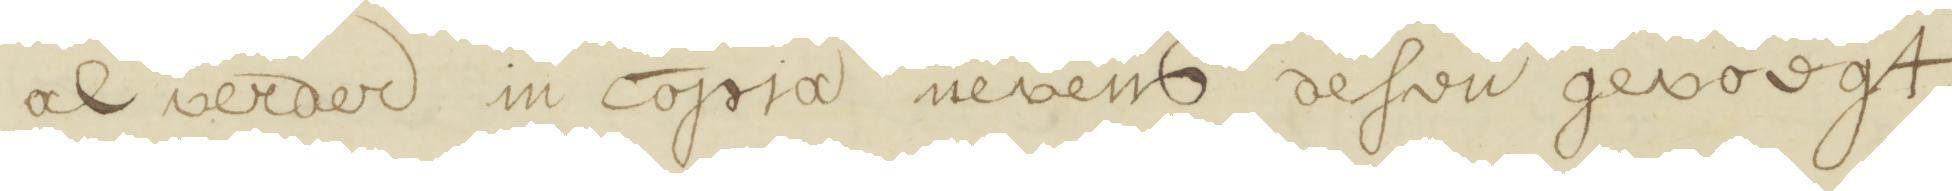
al verder in copia nevens desen gevoegt
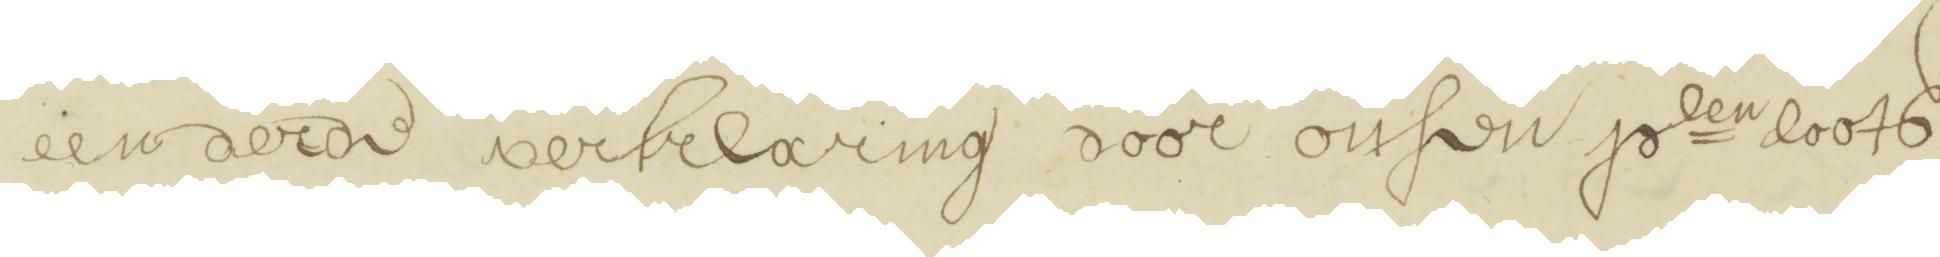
een derde verklaring door onsen p=len loots
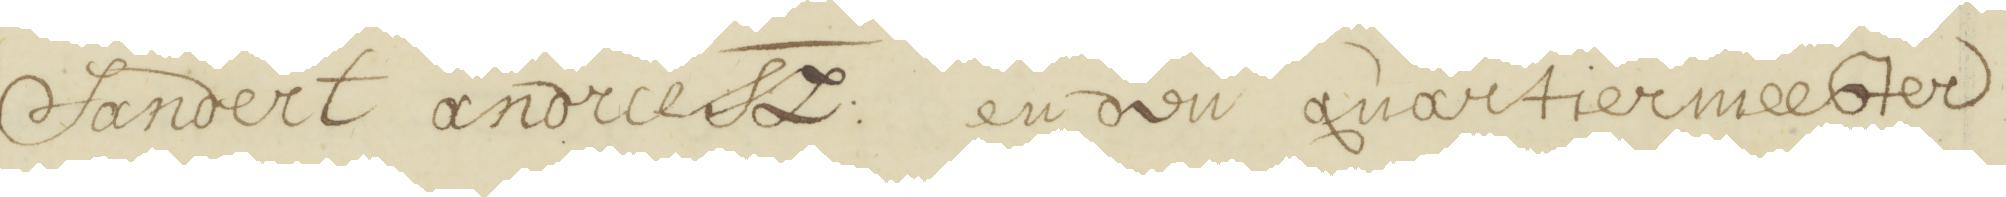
Sandert andriesz: en den quartiermeester
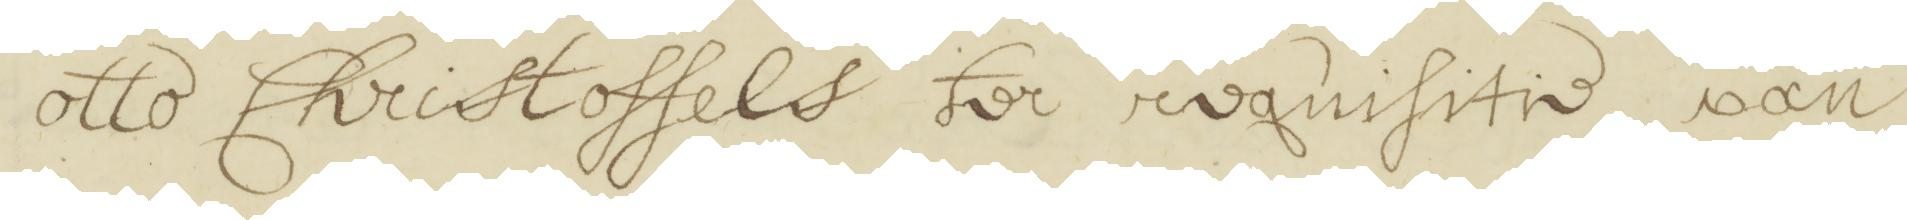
otto Christoffels ter requisitie van
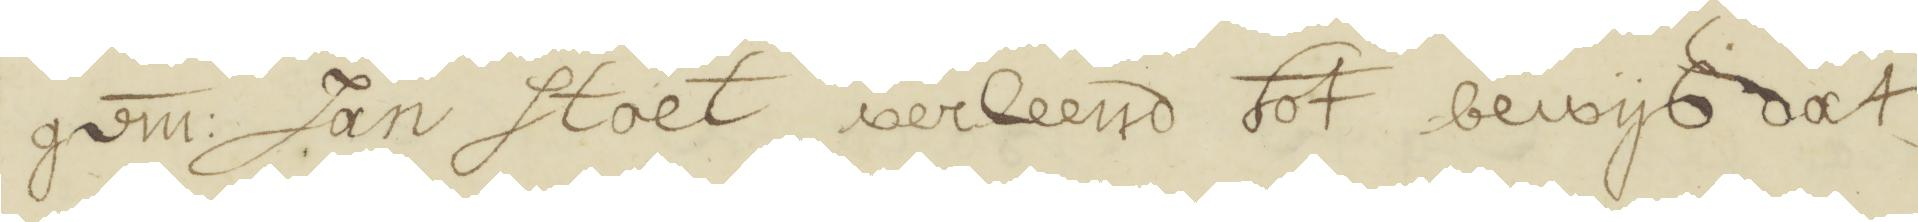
gem: Jan stoet verleend tot bewijs dat
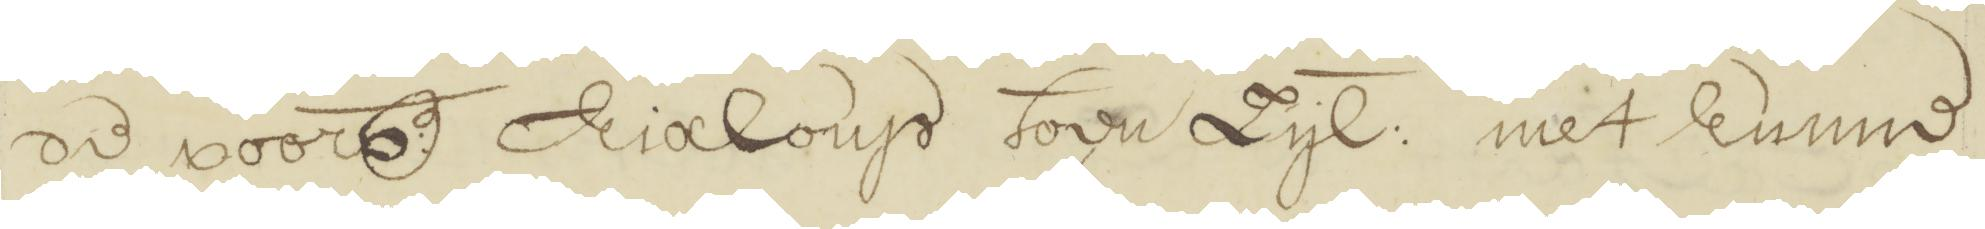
de voors: Chialoup toen zijl: met hunne
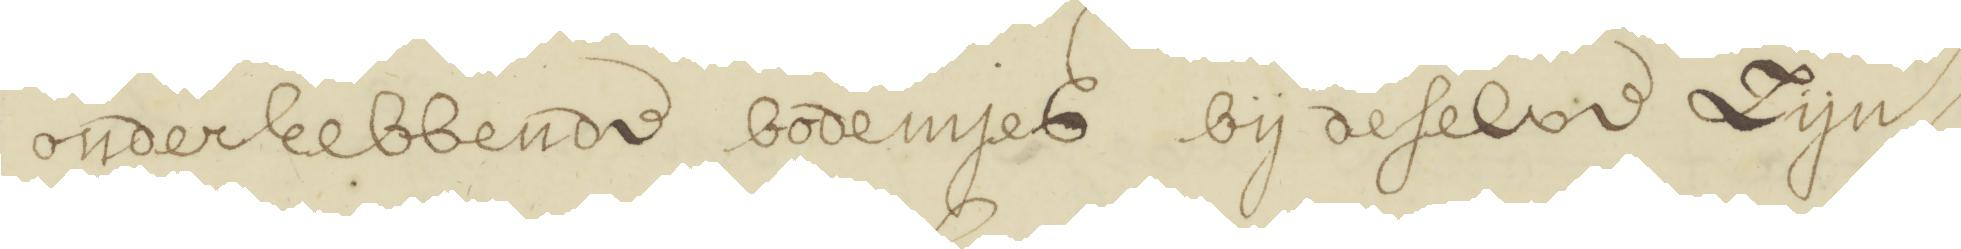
onderhebbende bodemjes bij deselve zijn
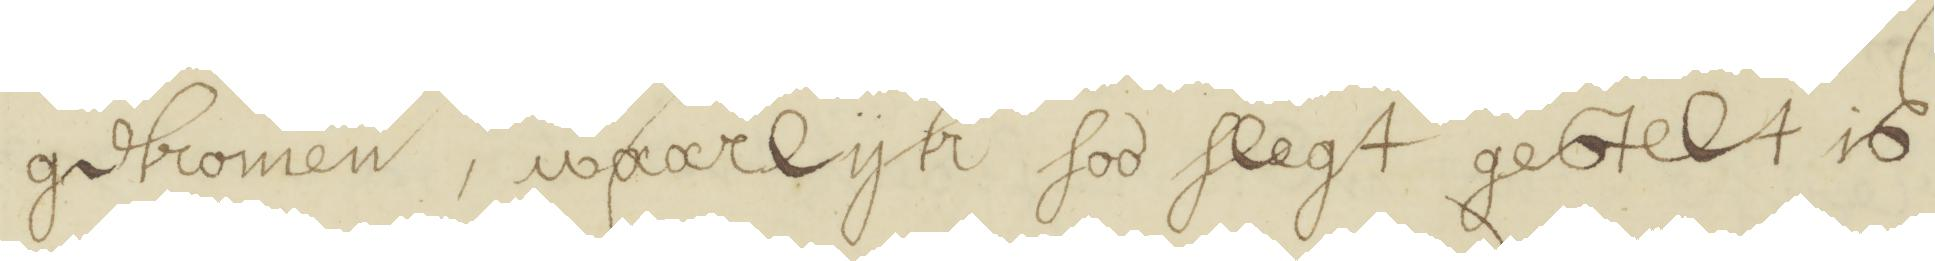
gekomen, waarlijk soo slegt gestelt is
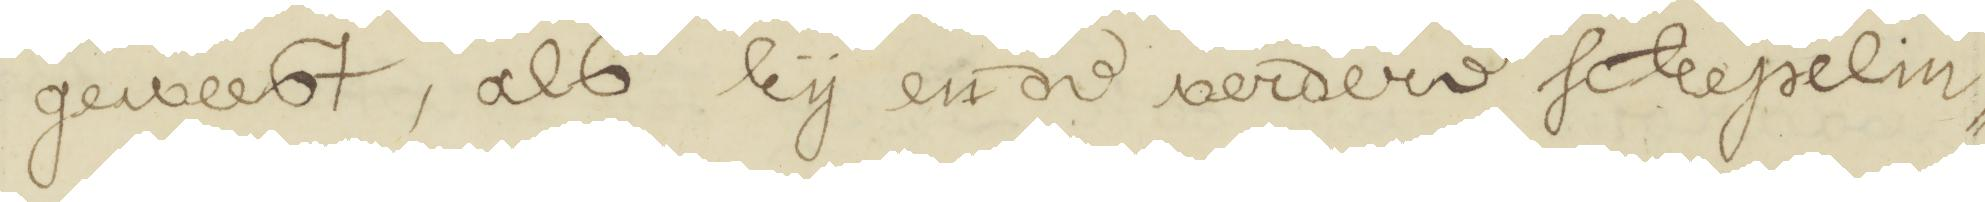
geweest, als hij en de verdere schepelin„
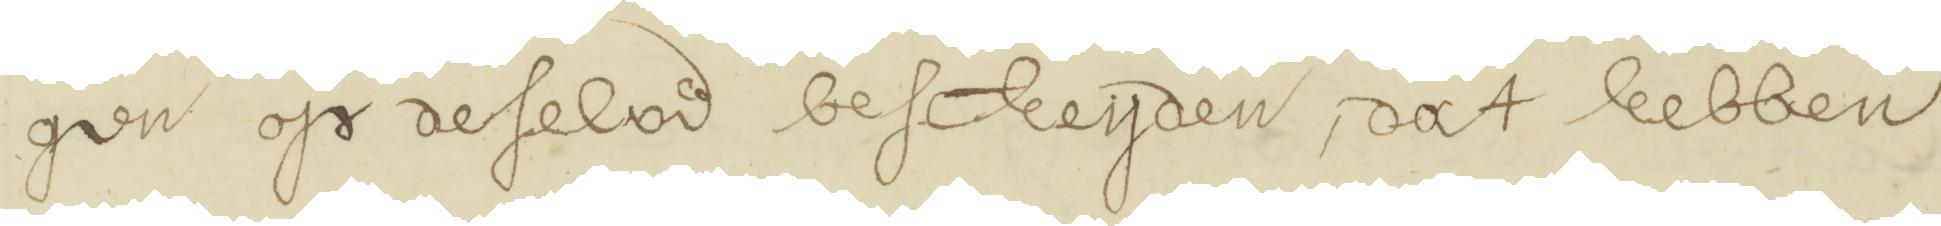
gen op deselve bescheijden, dat hebben
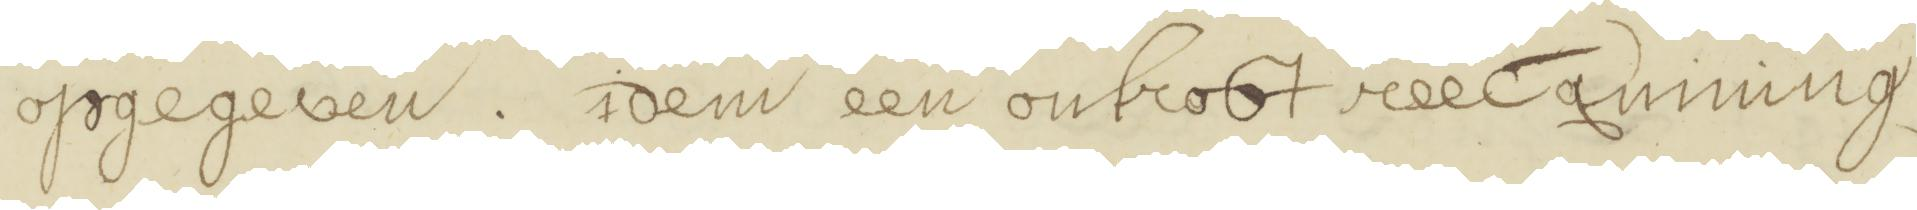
opgegeven. idem een onkost reecquining
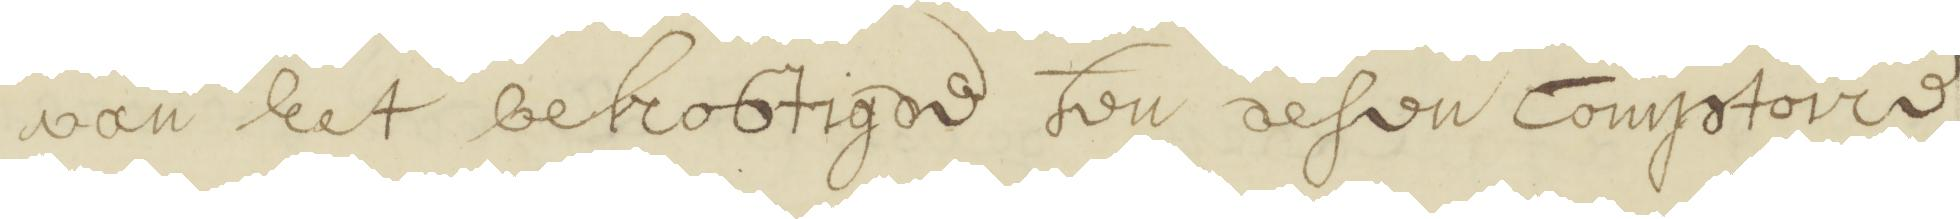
van het bekostigde ten desen comptoire
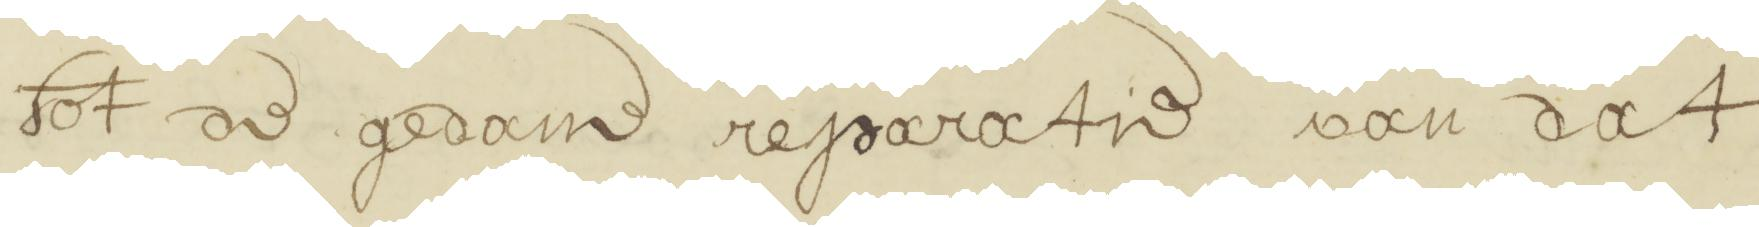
tot de gedane reparatie van dat
